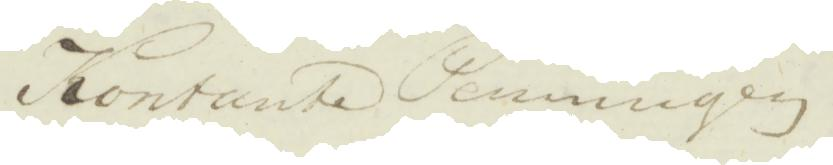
Kontante Penningen
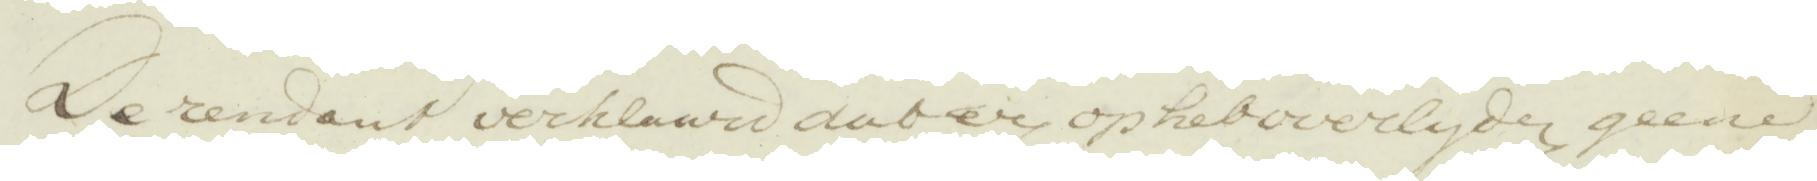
De rendant verklaard dat er op het overlyden geene
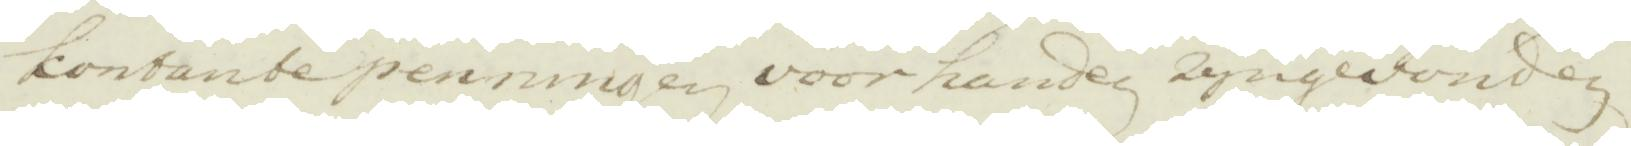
kontante penningen voor handen zijngevonden
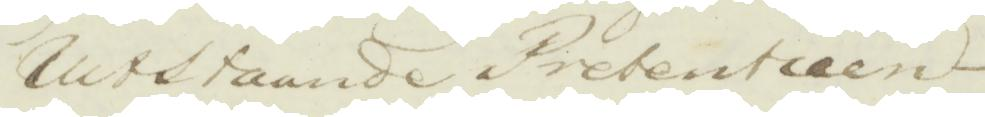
Uitstaande Pretentieen
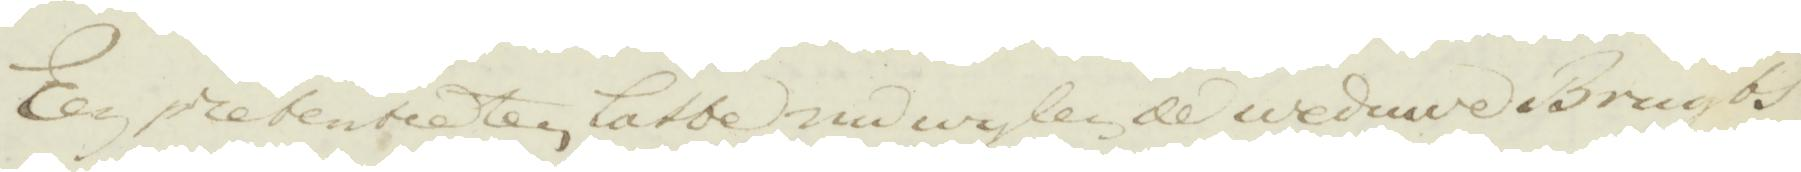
Een pretentie ten laste nu wylen de weduwe Brugts
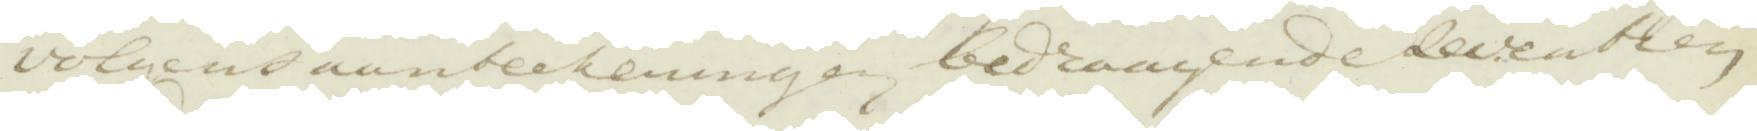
volgens aanteekening en bedraagende zeventien
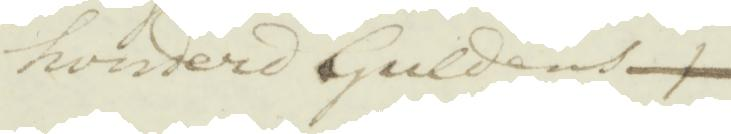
honderd Guldens—
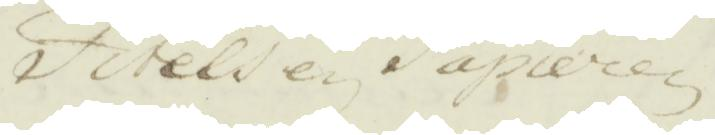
Titels en Papieren
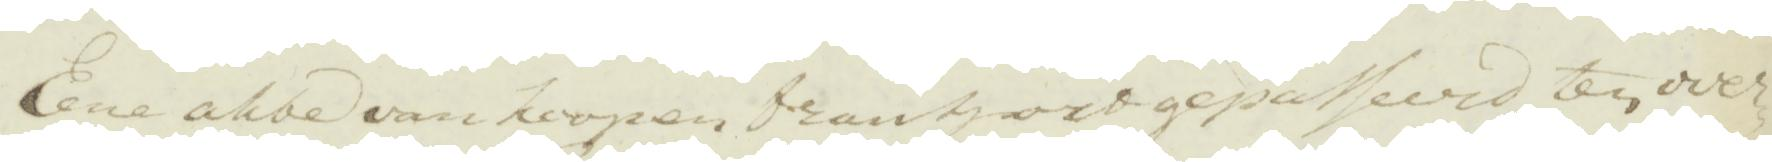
Eene akte van koop en Transport gepasseerd ten over
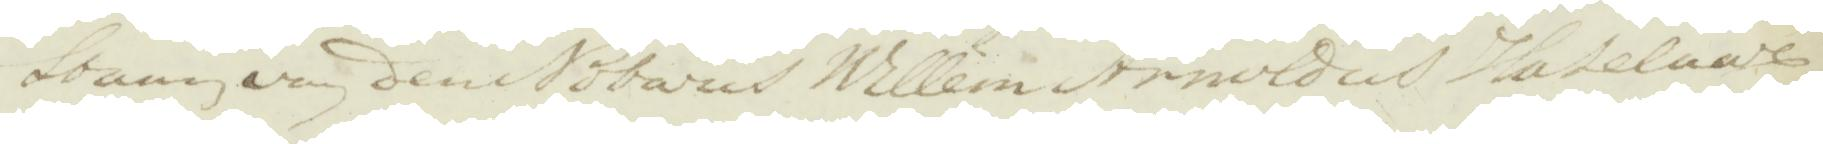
staan van den Notaris Willem Arnoldus Haselaar
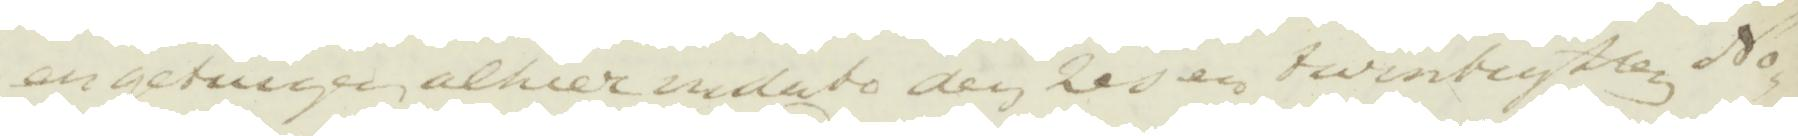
en getuigen alhier indato den zes en twintigsten No„
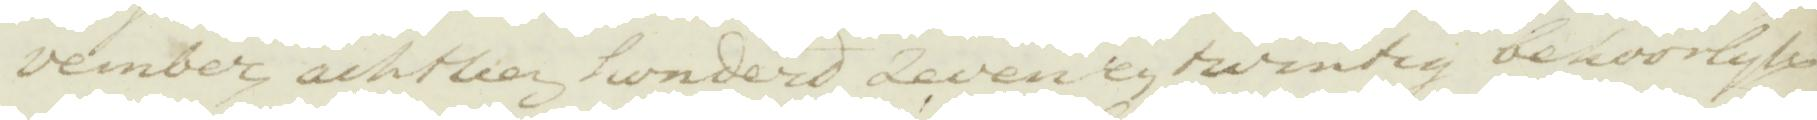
vember achttien honderd zeven en twintig behoorlyk
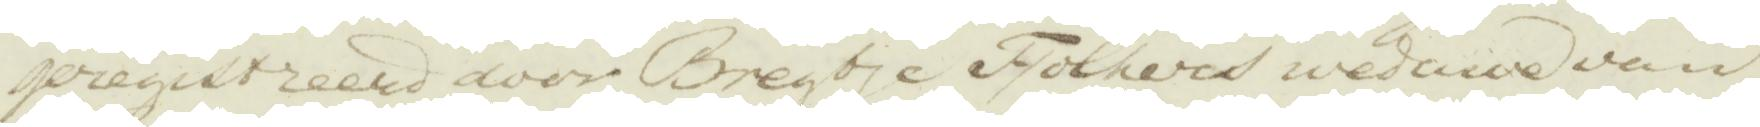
geregistreerd door Bregtje Folkers weduwe van
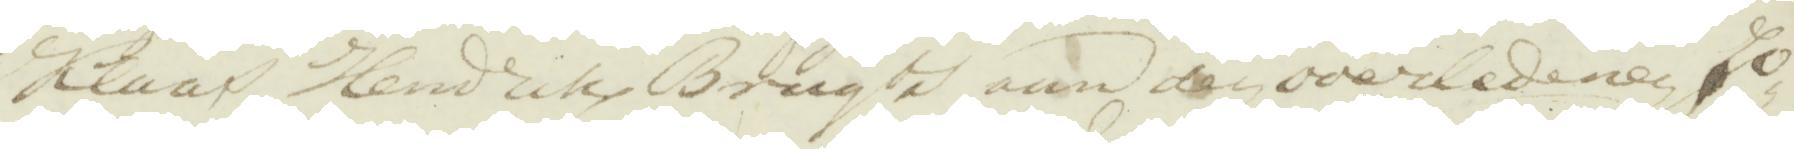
klaas Hendrik Brugts aan den overledenen Jo„
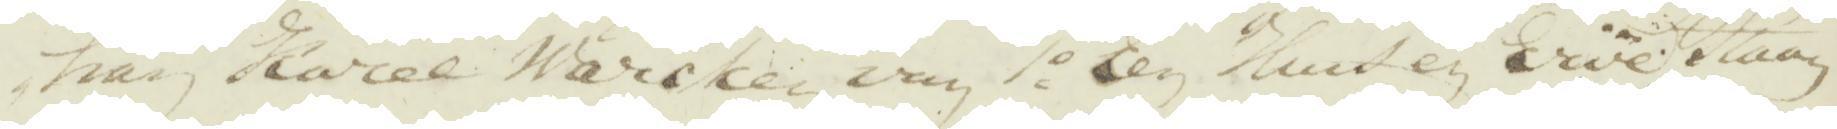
„han Karel Warcken van 1=e Een Huis en Erve staan
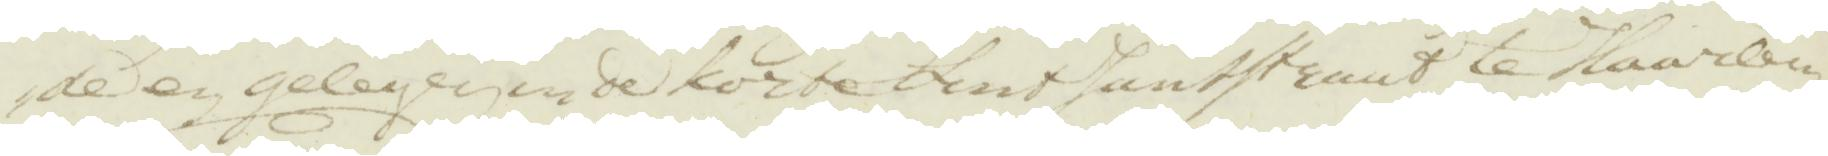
de en gelegen in de korte Sint Jansstraat te Haarlem
